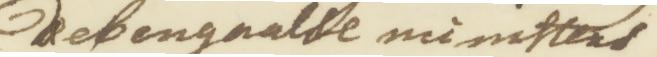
de bengaalse ministers
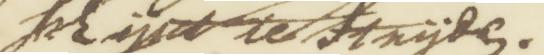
schijnt te strijden.
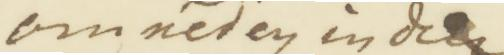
om reden in den
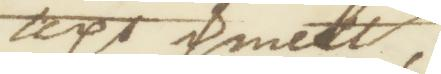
text vermelt.
